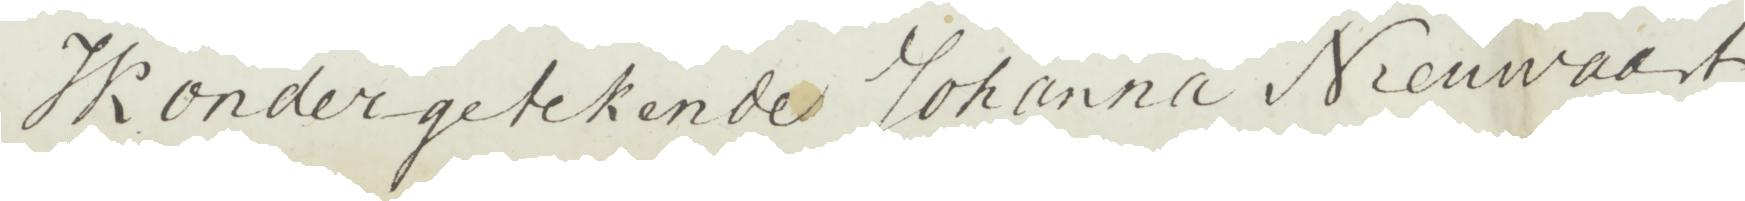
Ik ondergetekende Johanna Nieuwaart
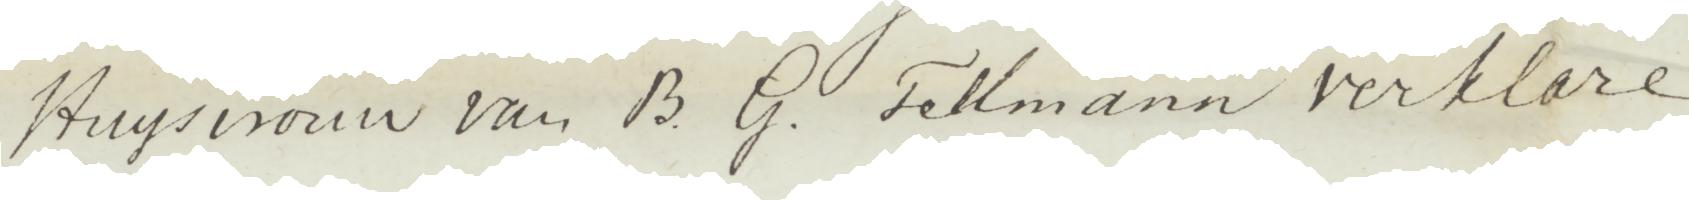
Huysvrouw van B. G. Tellmann verklare
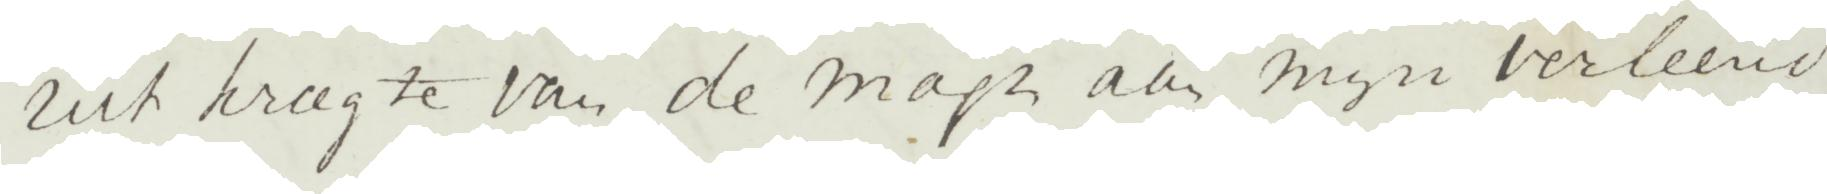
uit kragte van de magt aan myn verleend
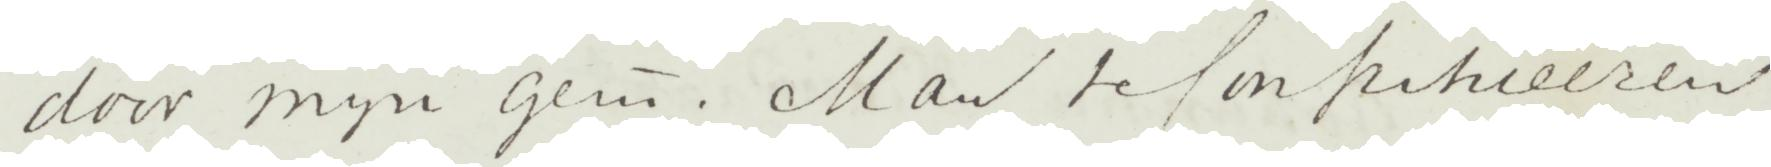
door myn gem. Man te Constitueeren
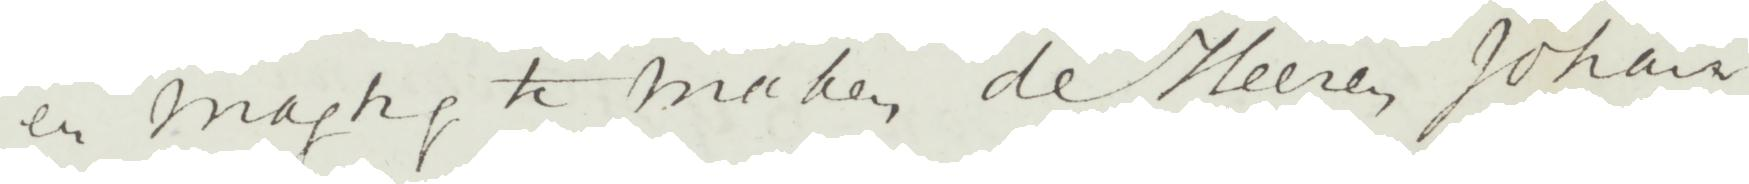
en magtig te maken de Heeren Johan
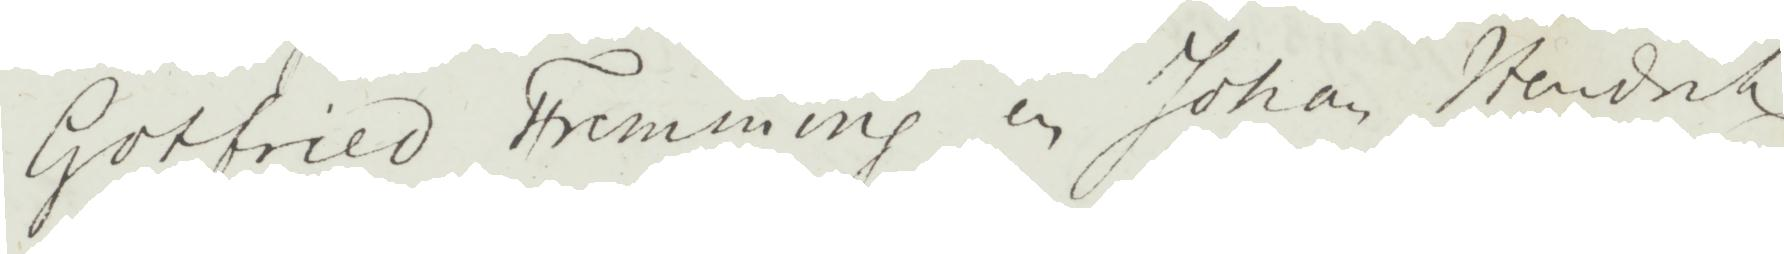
Gotfried Fremming en Johan Hendrik
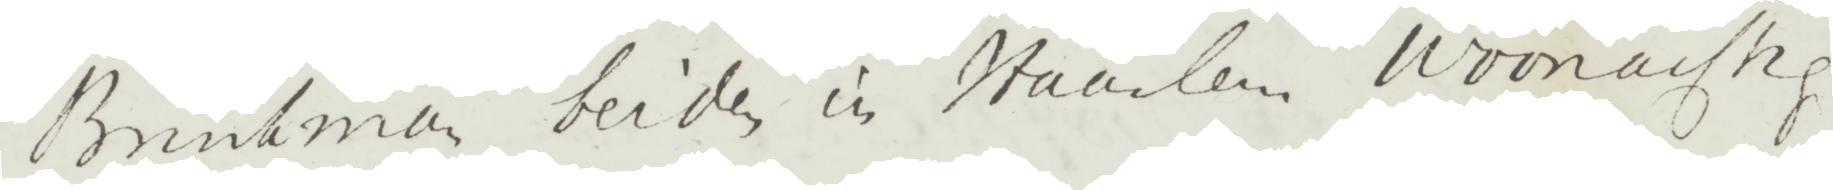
Brinkman beiden in Haarlem woonachtig
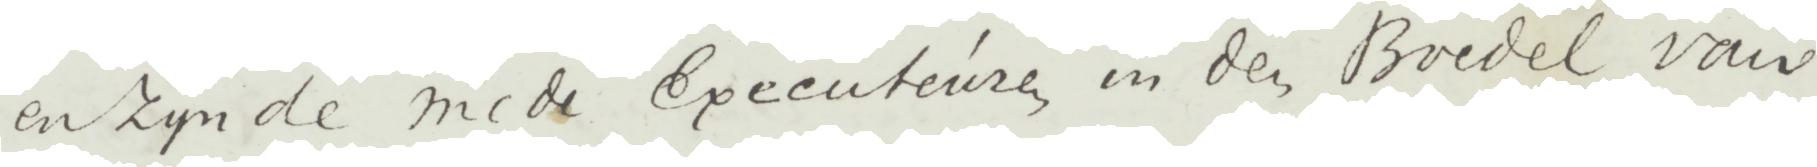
en zyn de mede Executeuren in den Boedel van
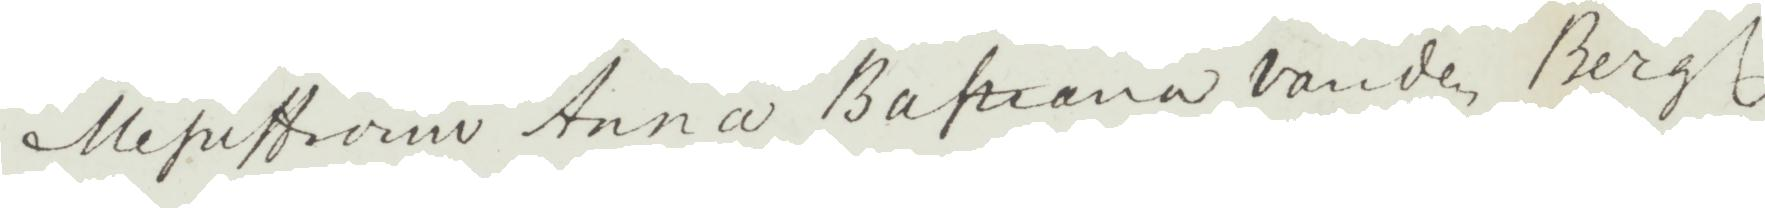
Mejuffrouw Anna Bastiana van den Bergh
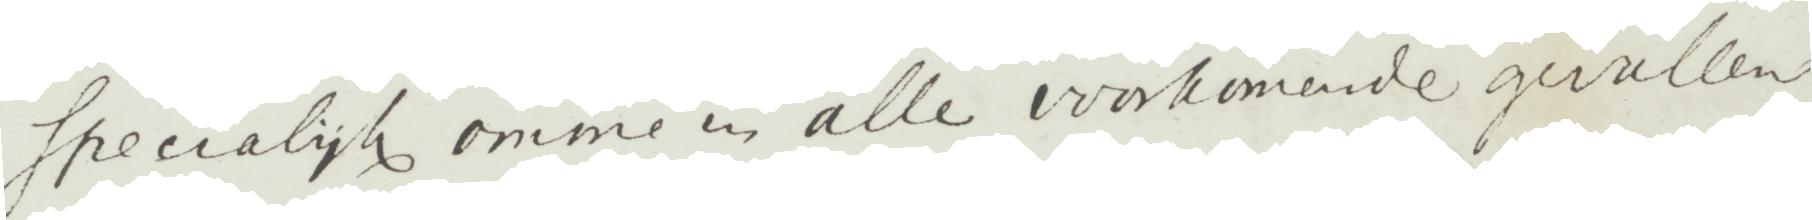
specialijk omme in alle voorkomende gevallen
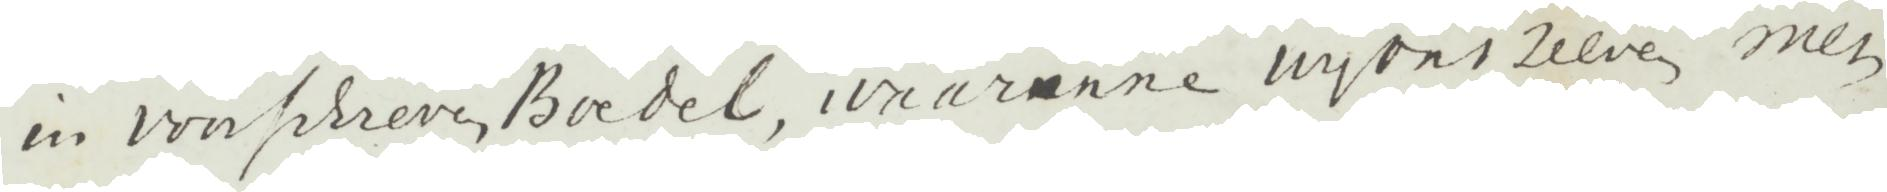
in voorschreve Boedel, waarinne wy ons zelven niet
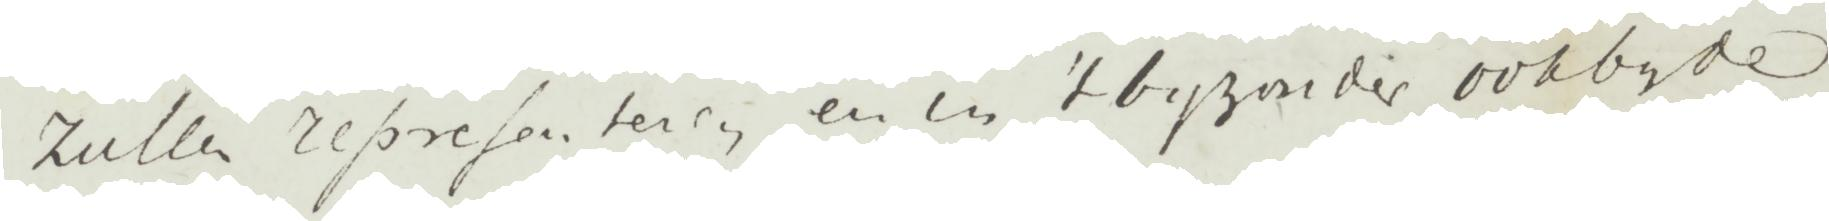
zullen representeren en in ’t byzonder ook by de
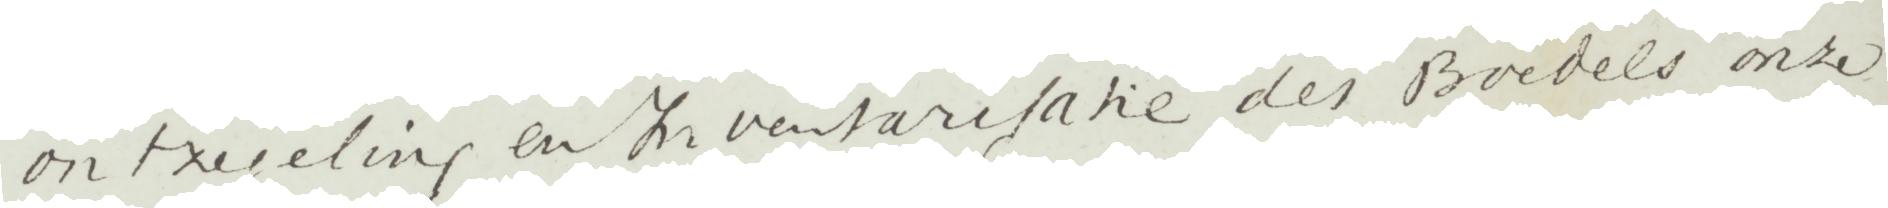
ontzegeling en Inventarisatie des Boedels onze
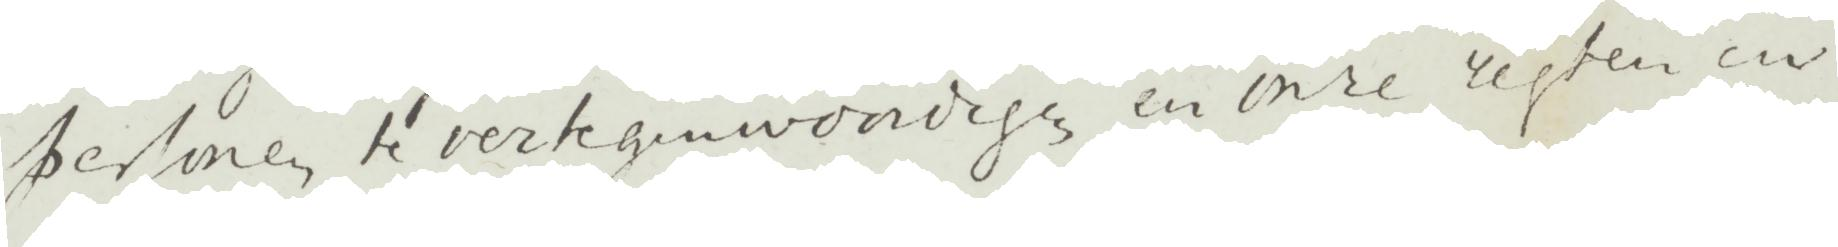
personen te vertegenwoordigen en onze regten en
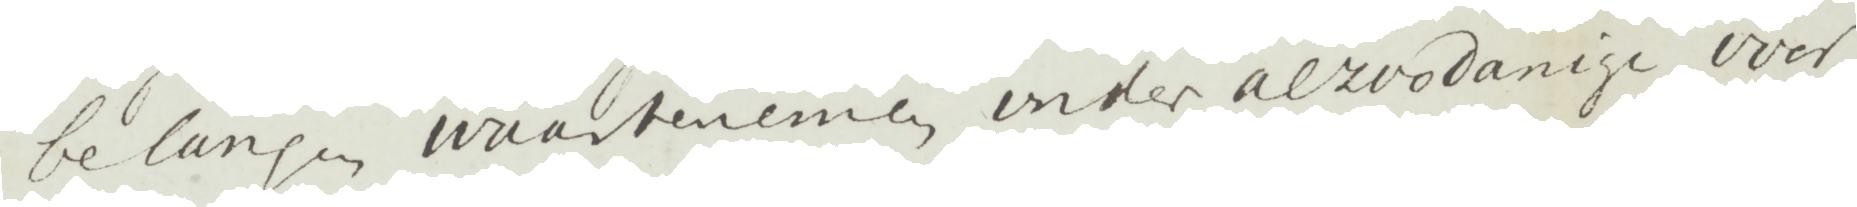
belangen waartenemen onder alzoodanige voor.
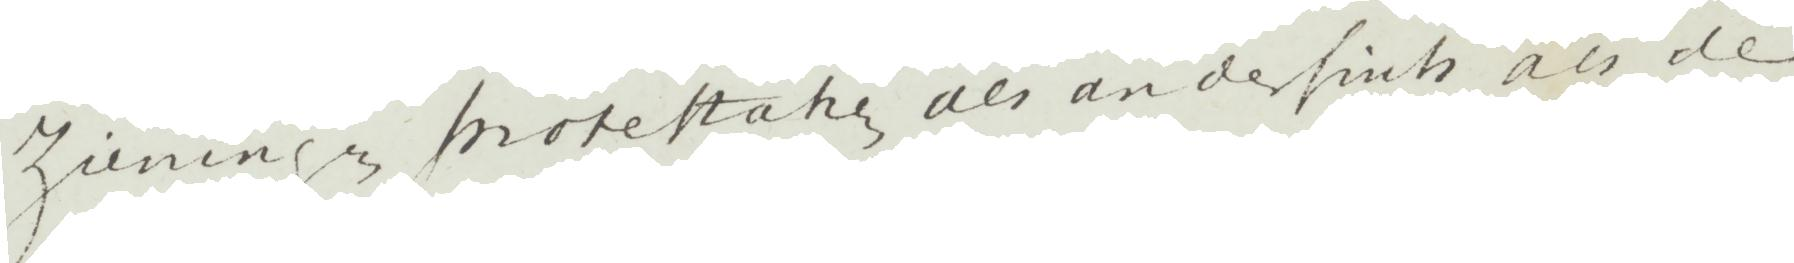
Zieningen protestatien als andersints als de
